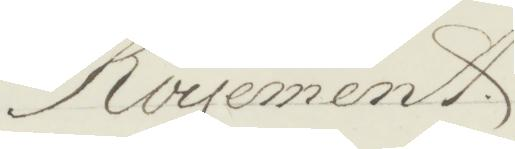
Roijement.
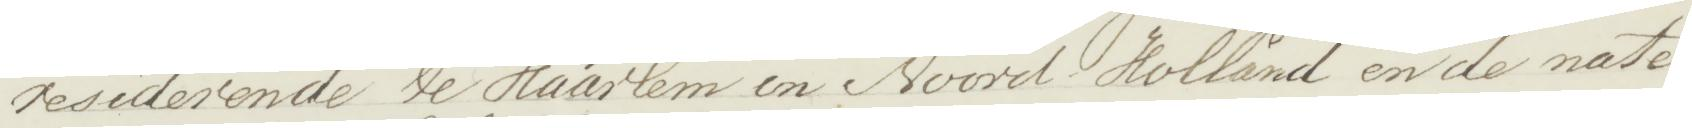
residerende te Haarlem in Noord-Holland en de nate
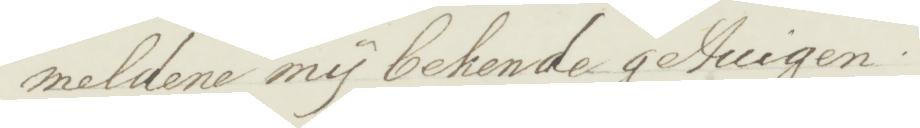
meldene mij bekende getuigen.
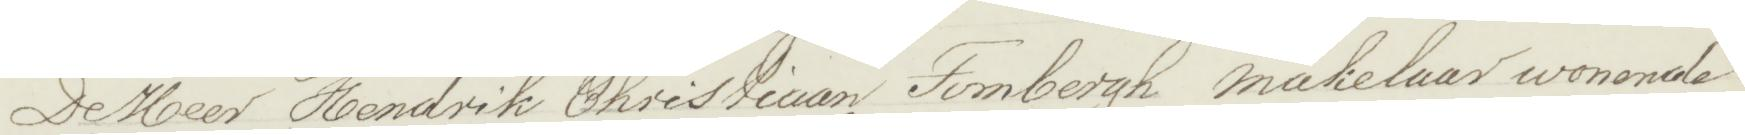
De Heer Hendrik Christiaan Tombergh makelaar wonende
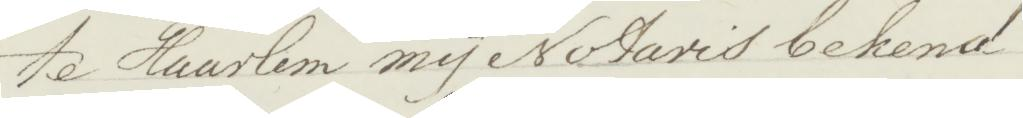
te Haarlem mij Notaris bekend
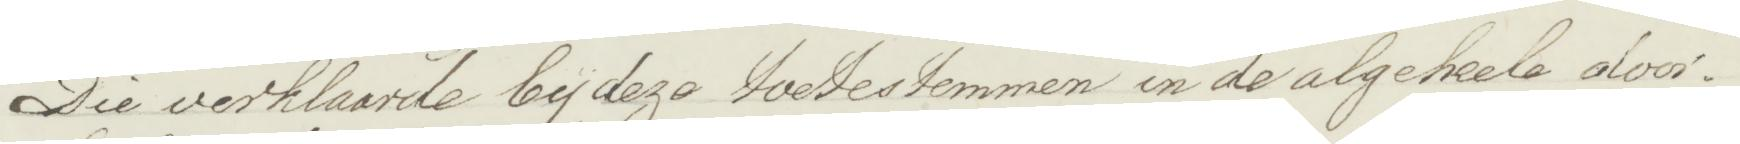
Die verklaarde bij deze toetestemmen in de algeheele door
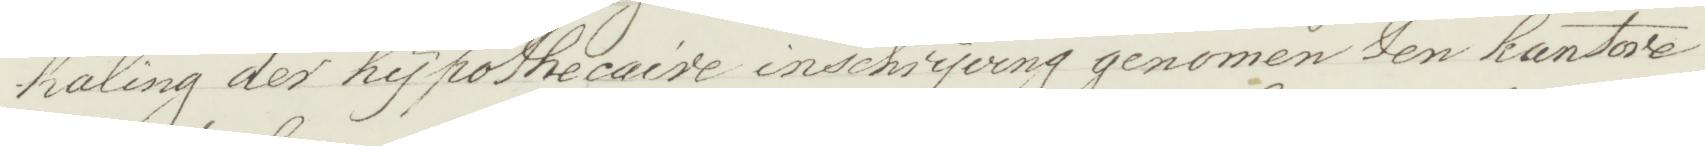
haling der hijpothecaire inschrijving genomen ten kantore
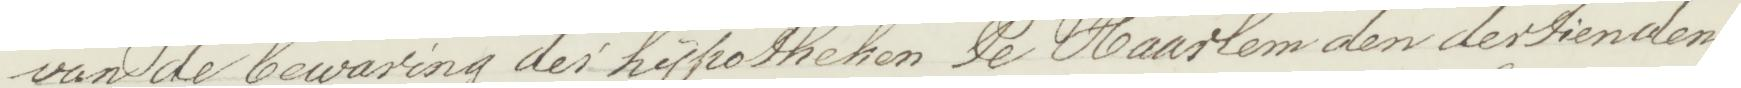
van de bewaring der hijpotheken te Haarlem den dertienden
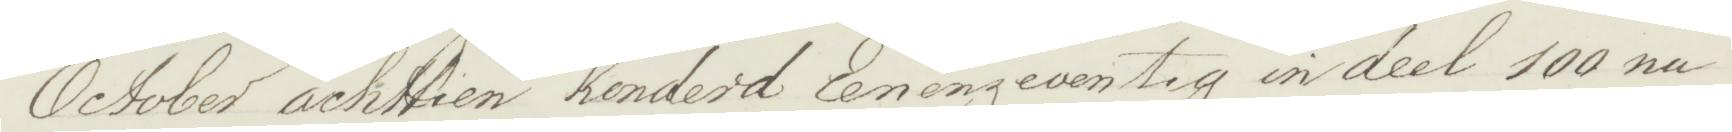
October achttien honderd Een en zeventig in deel 100 nu
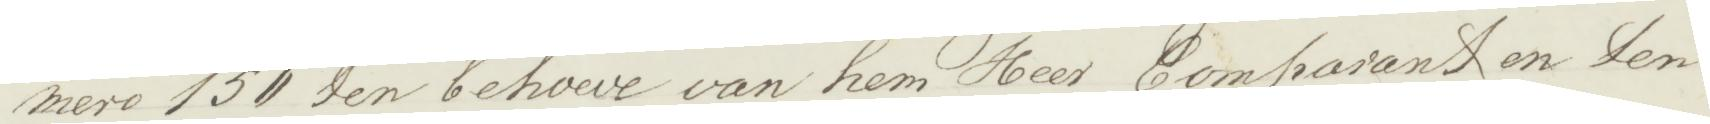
mero 156 ten behoeve van hem Heer Comparant en ten
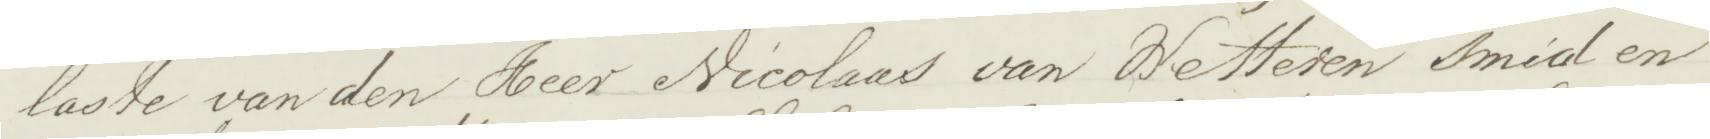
laste van den Heer Nicolaas van Wetteren smid en
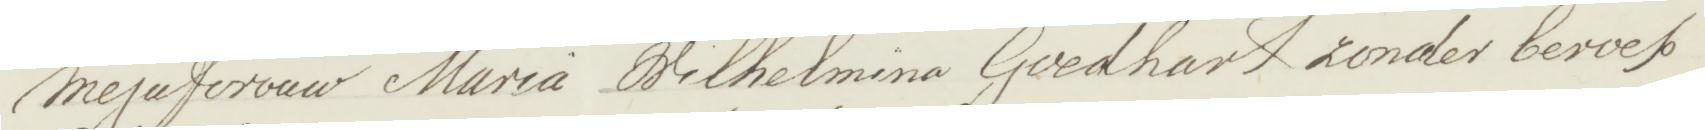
mejufvrouw Maria Wilhelmina Goedhart zonder beroep
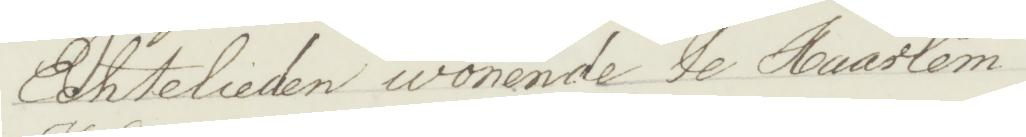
Echtelieden wonende te Haarlem
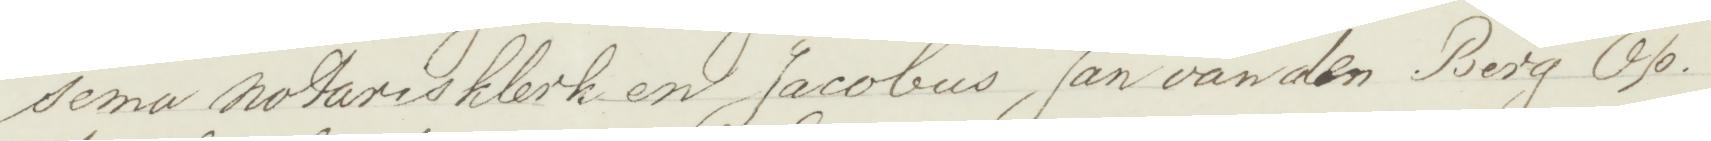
sema notaris klerk en Jacobus Jan van den Berg Op.
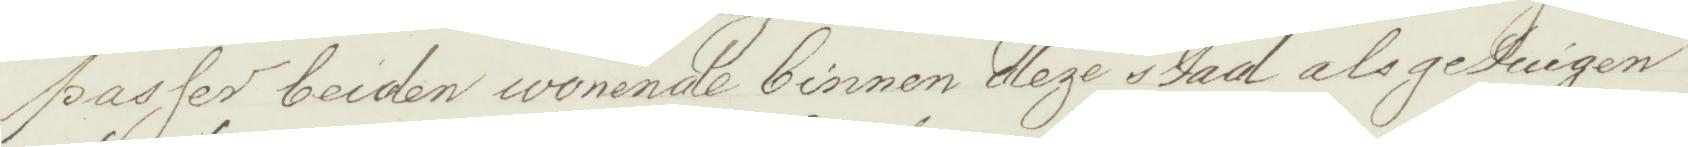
passer beiden wonende binnen deze stad als getuigen
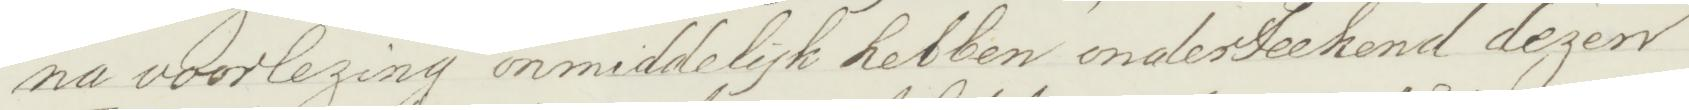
na voorlezing onmiddelijk hebben onderteekend dezen
